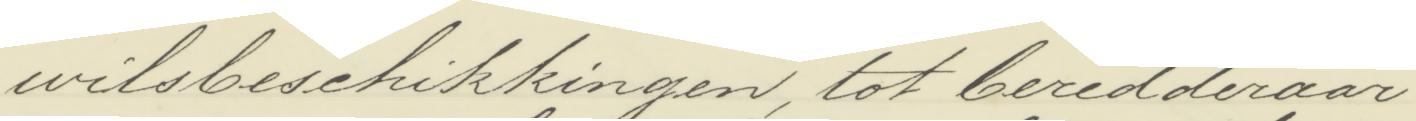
wilsbeschikkingen, tot beredderaar
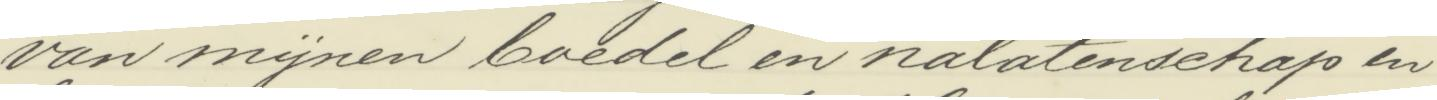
van mijnen boedel en nalatenschap en
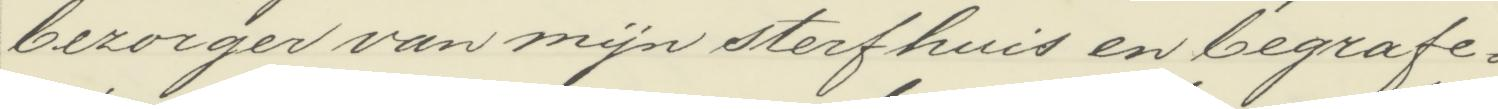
bezorger van mijn sterfhuis en begrafe=
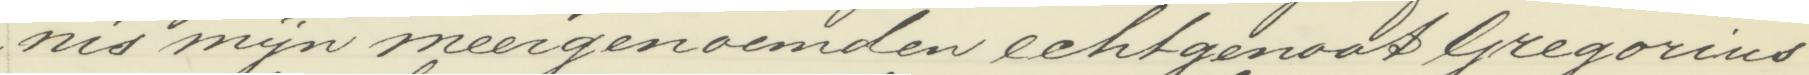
nis mijn meergenoemden echtgenoot Gregorius
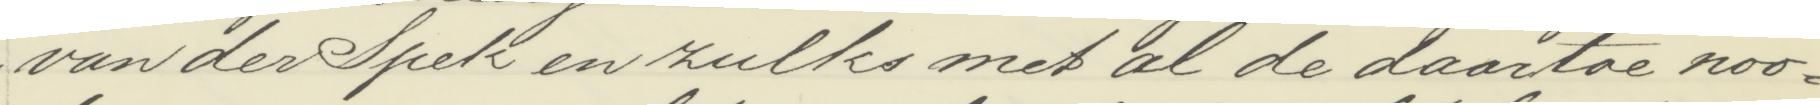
van der Spek en zulks met al de daartoe noo=
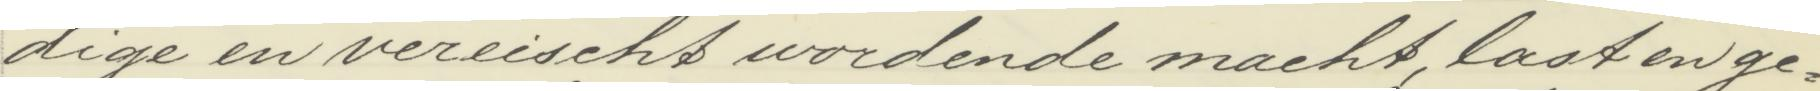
dige en vereischt wordende macht, last en ge=
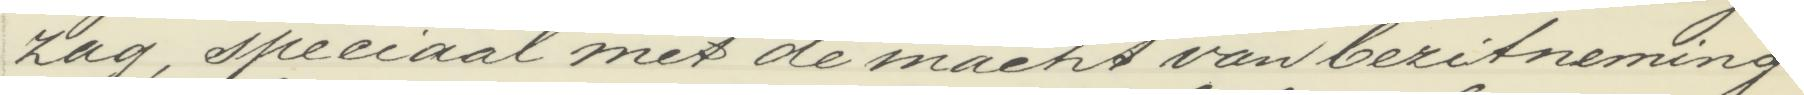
zag, speciaal met de macht van bezitneming
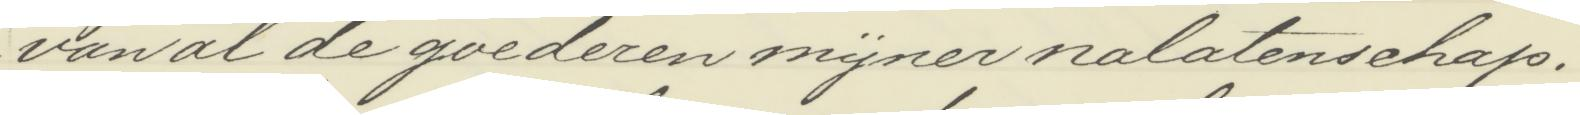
van al de goederen mijner nalatenschap.
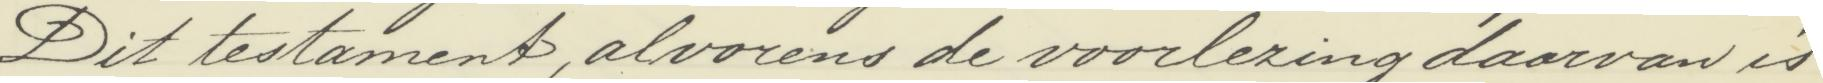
Dit testament, alvorens de voorlezing daarvan is
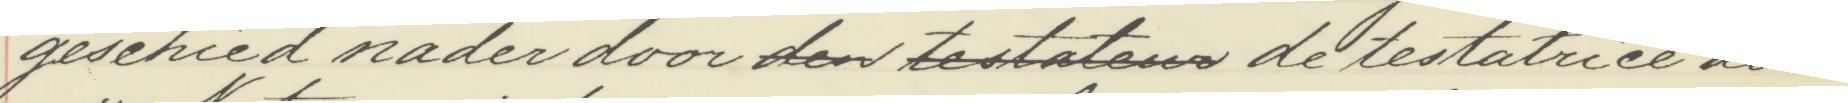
geschied nader door den testateur de testatrice aan
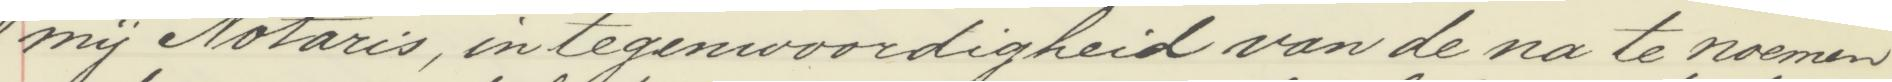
mij Notaris, in tegenwoordigheid van de na te noemen
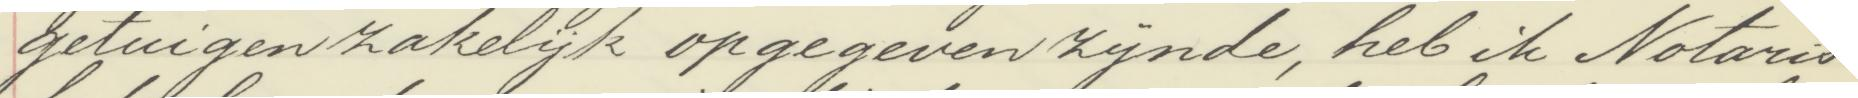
getuigen zakelijk opgegeven zijnde, heb ik Notaris
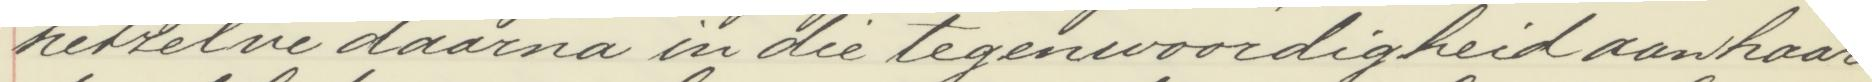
hetzelve daarna in die tegenwoordigheid aan haar
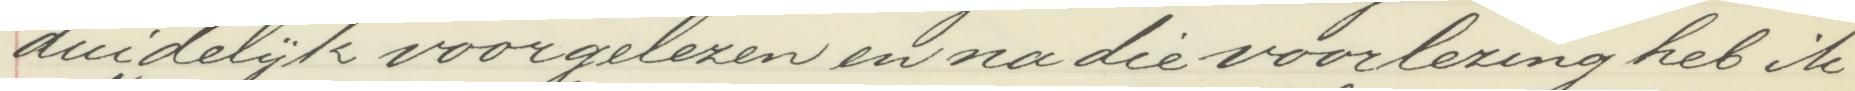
duidelijk voorgelezen en na die voorlezing heb ik
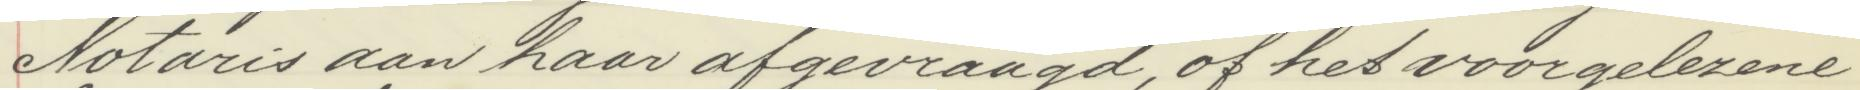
Notaris aan haar afgevraagd, of het voorgelezene
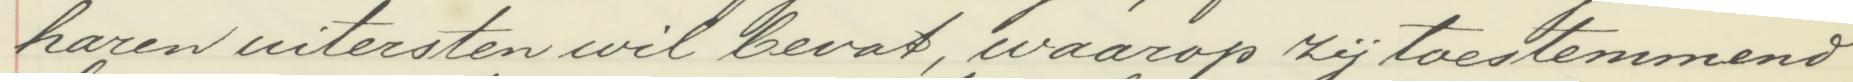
haren uitersten wil bevat, waarop zij toestemmend
